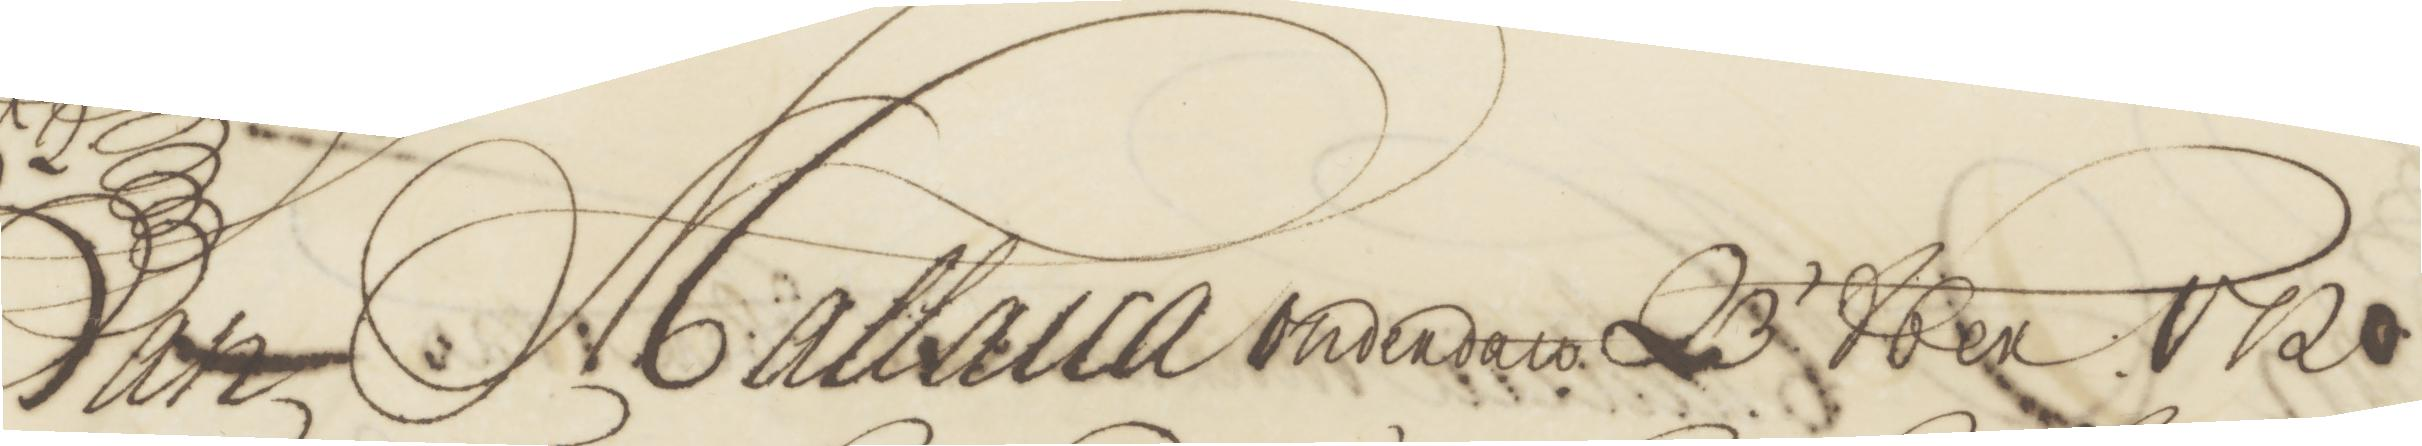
Van Mallacca onder dato 23' 8ber :1720.
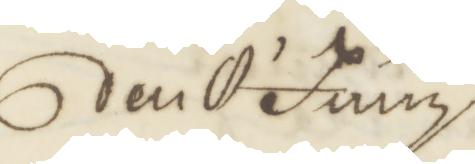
den 8' Junij
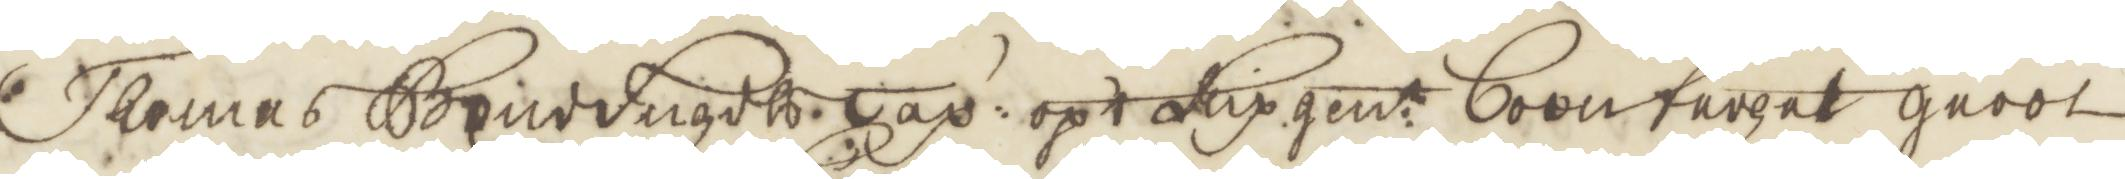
Thomas Bone Engels. Cap:' op 't schip gen:t boon fregat groot
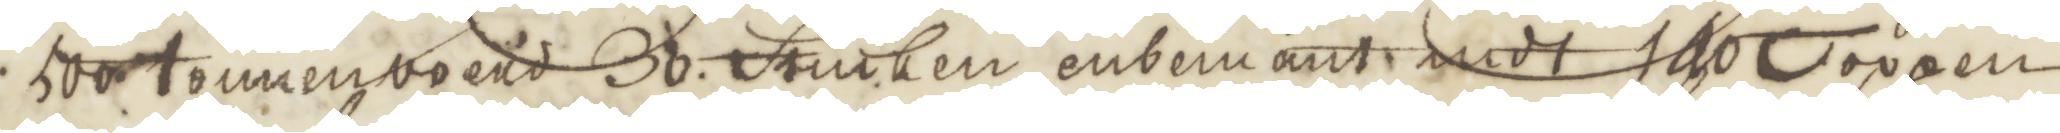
500 tonnen voerd 30. stucken en bemant met 140 Coppen
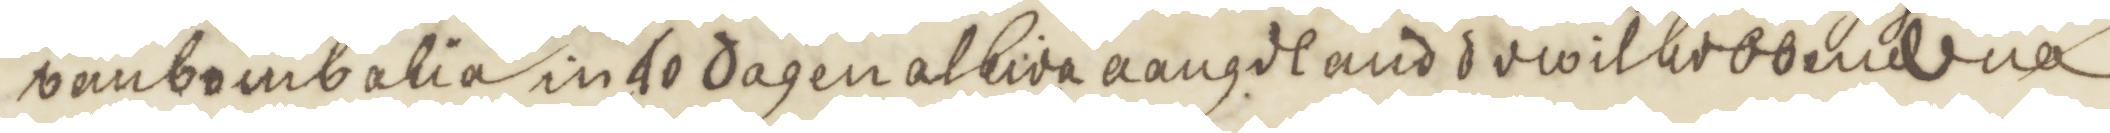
van bombahia in 40 dagen alhier aangeland de wil hebbende na
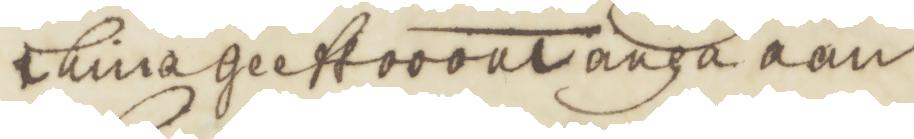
china geeft voor carga aan
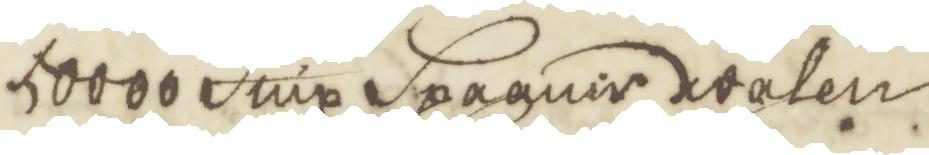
50000 stux spaance realen
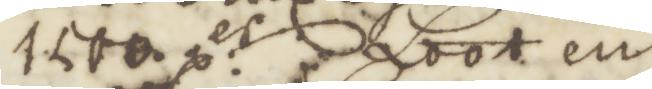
1500. p:es Loot en
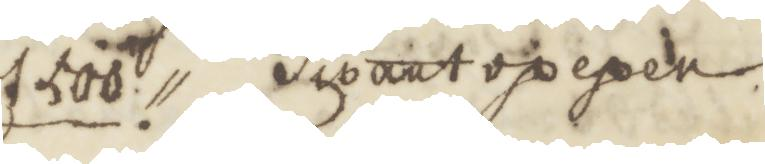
1500„ swarte peper
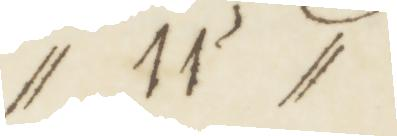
„ 11' „
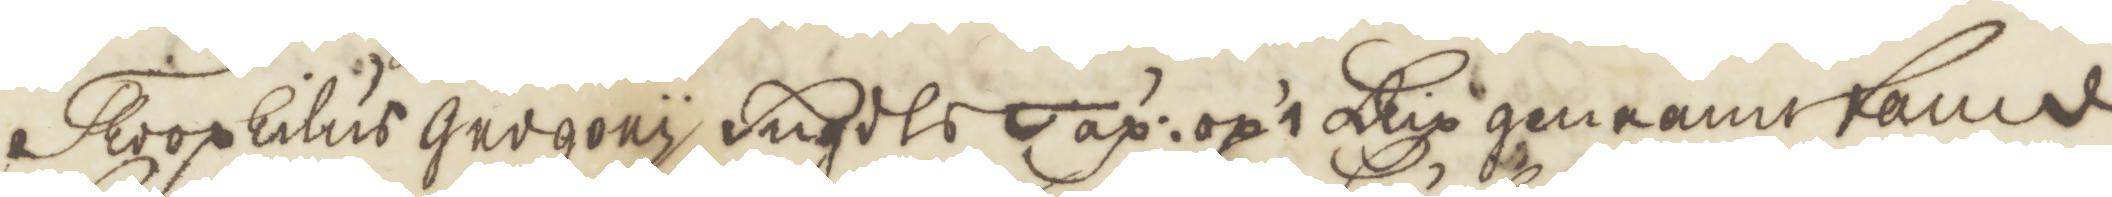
Theophilus gregorij Engels Cap:' op ’t schip genaamt Fame
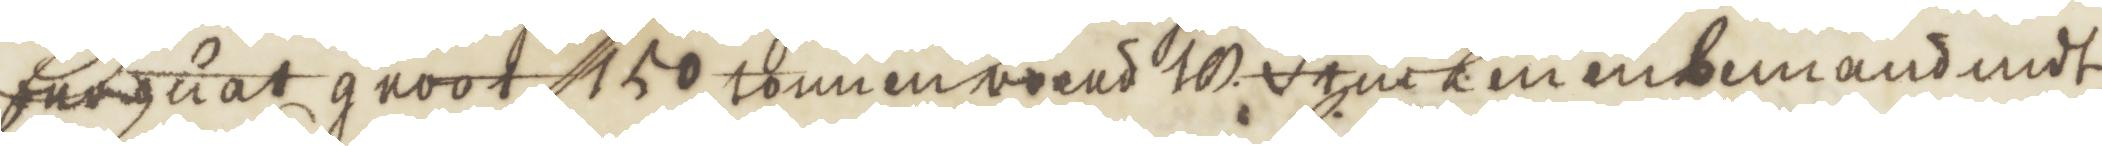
freguat groot 150 tonnen voerd 18. stucken en bemand met
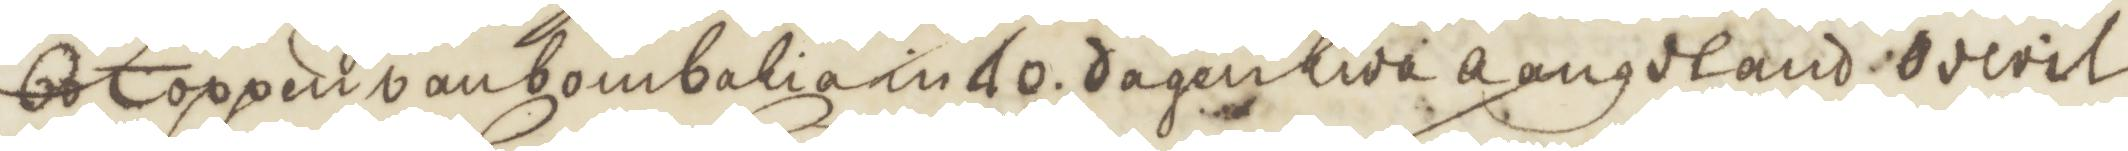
60 Coppen van bombahia in 40. dagen hier aangeland dewil
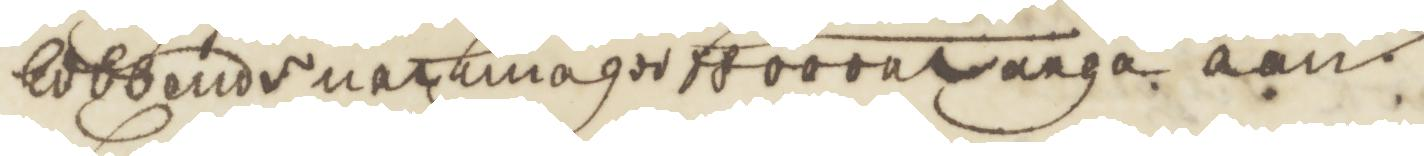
hebbende na china gev ƒ80000 carga aan.
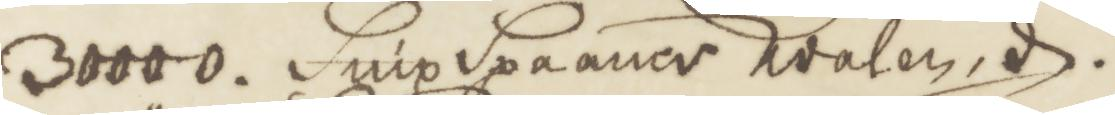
30000. stux spaance realen, en.
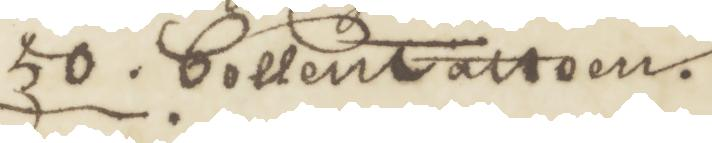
50. bollencattoen.
